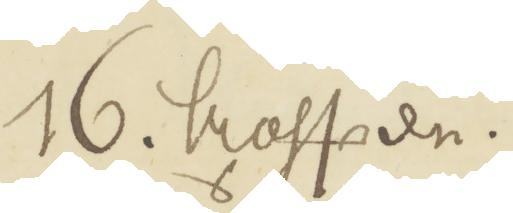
16. koppen.
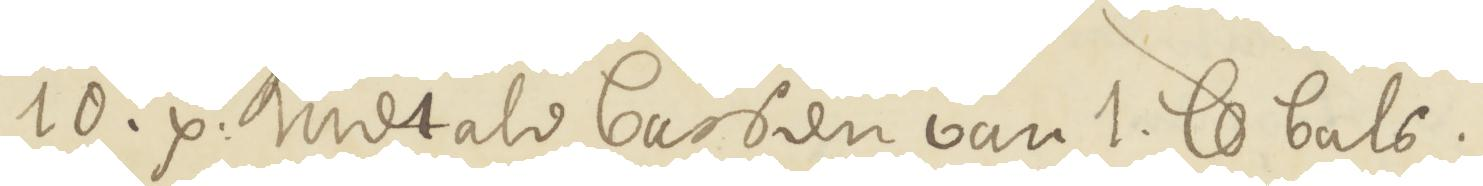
10. p:s metale bassen van 1. lb bals.
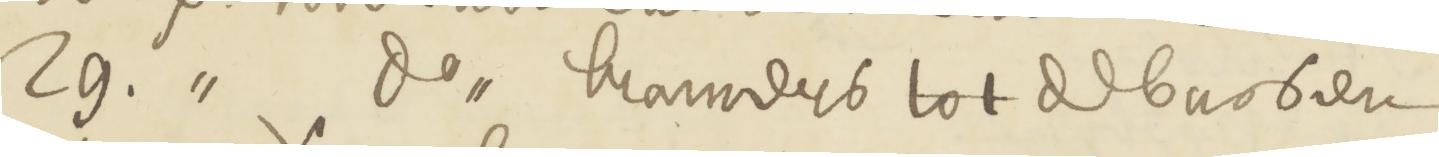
29. „ d=o kamers tot de bassen
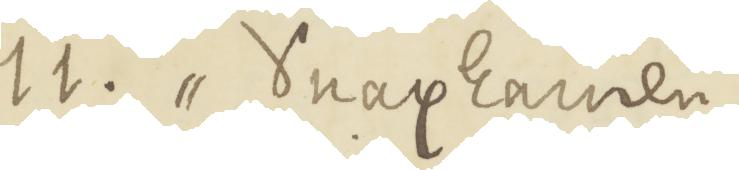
11. „ Snaphanen
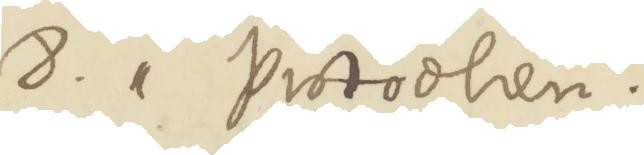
8. „ pistoelen.
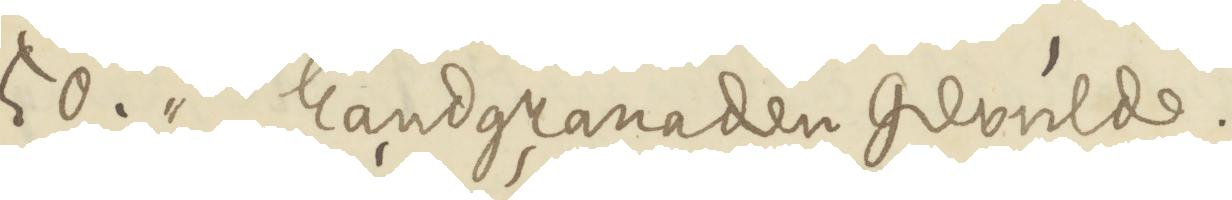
50. „ handgranaden gevulde.
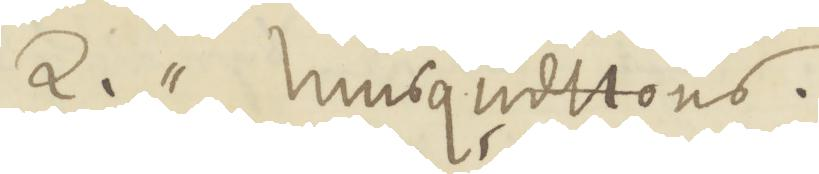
2. „ musquettons.
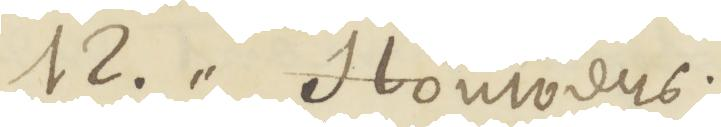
12. „ Houwers.
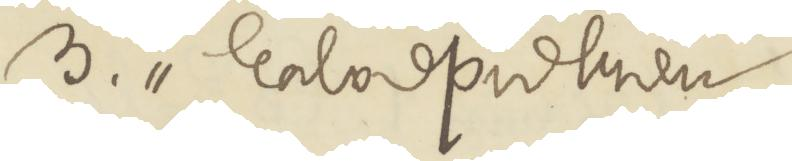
3. „ haloepieken.
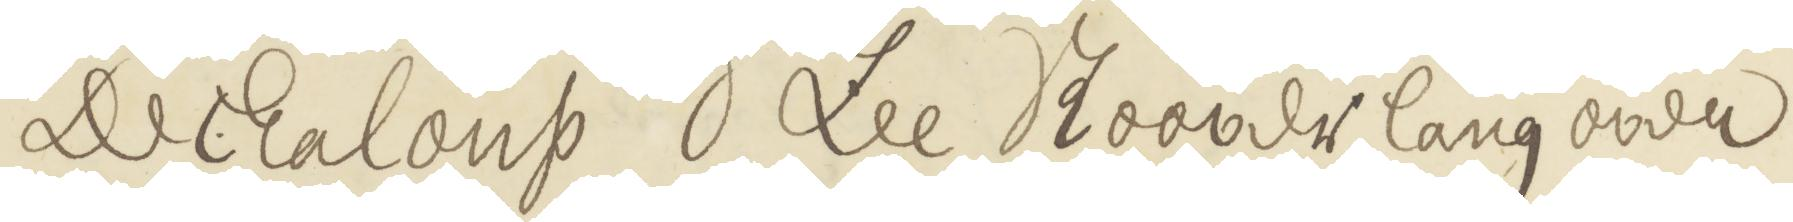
De Chaloup d' Zee Roover lang over
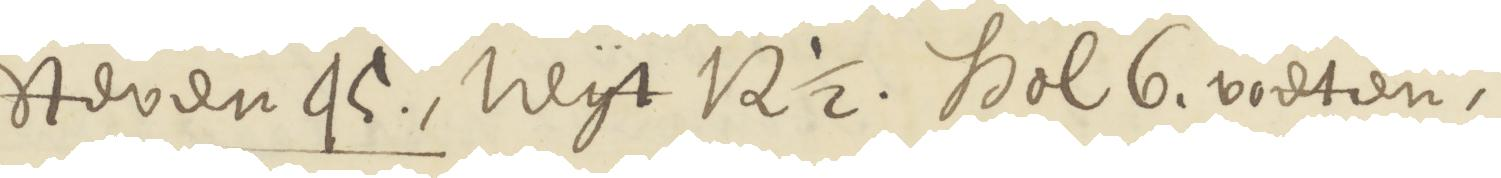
steven 45., wijt 12½. hol 6. voeten,
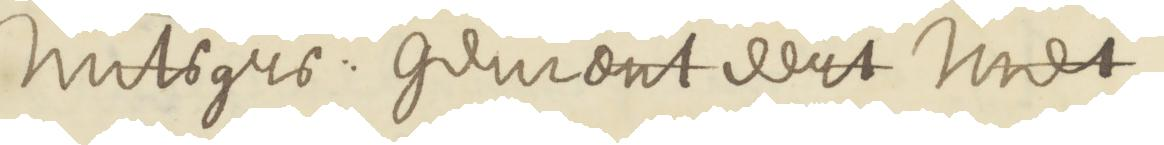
mitsgrs: gemonteert met
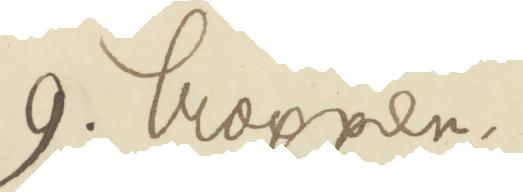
9. koppen.
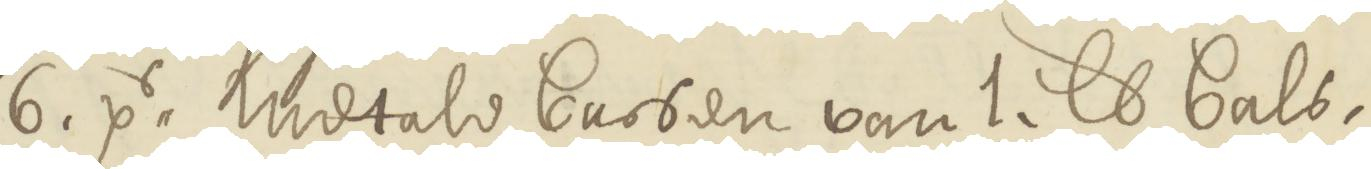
6. p„s Metale bassen van 1. lb bals.
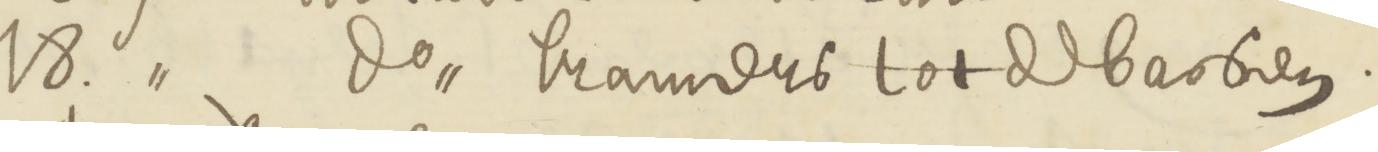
18. „ d„o kamers tot de bassen.
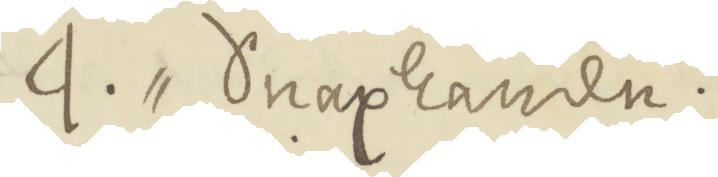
4. „ snaphanen.
